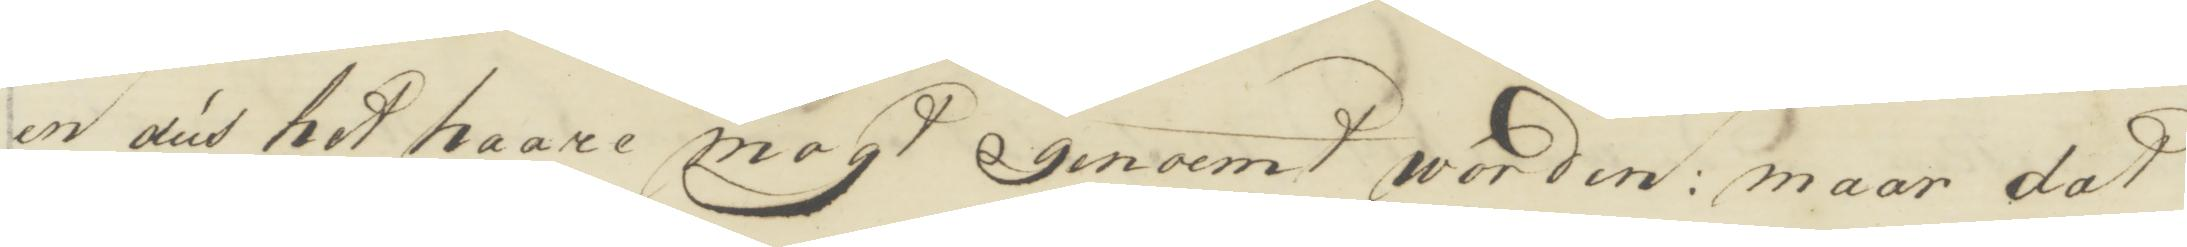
en dus het haare mogt genoemt worden: maar dat
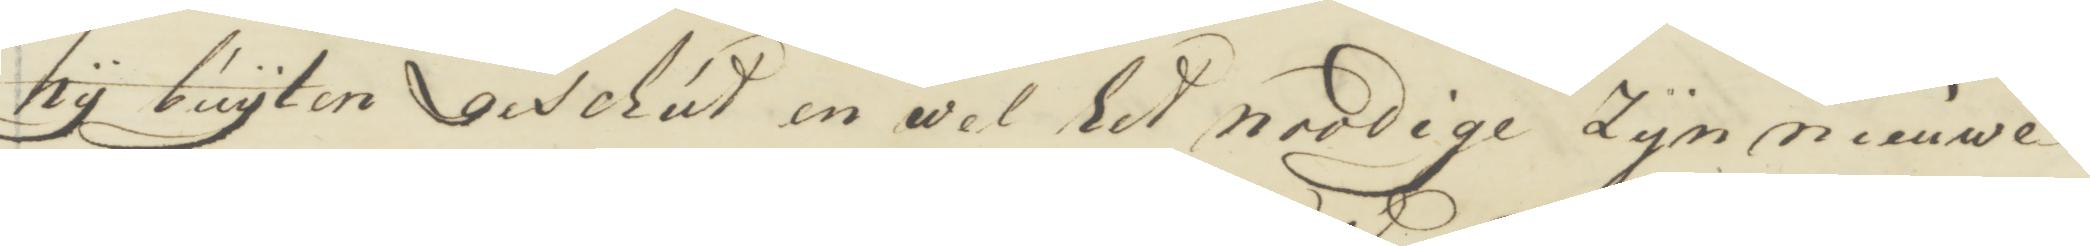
hij buijten geschut en wel het noodige zijn nieuwe
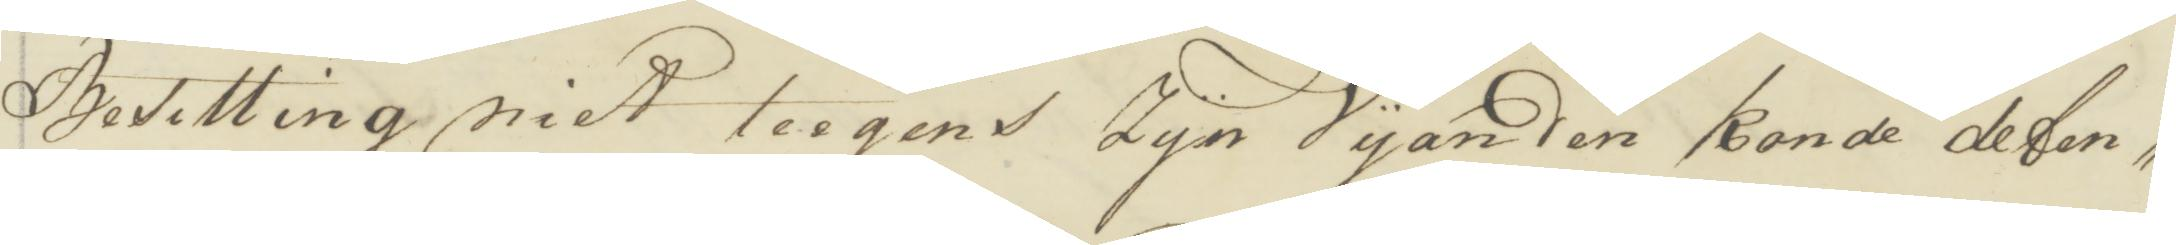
Besitting niet teegens zijn Vijanden konde defen„
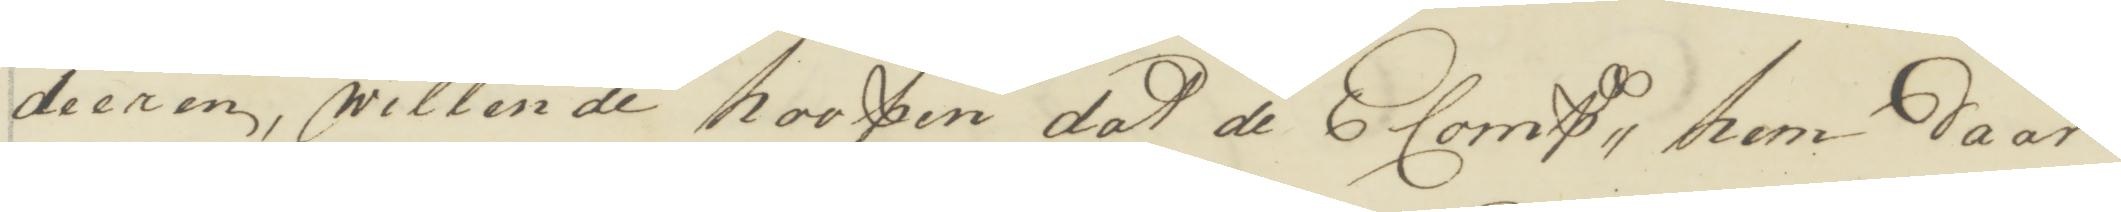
deeren, willen de hoopen dat de E:Comp„e hem daar
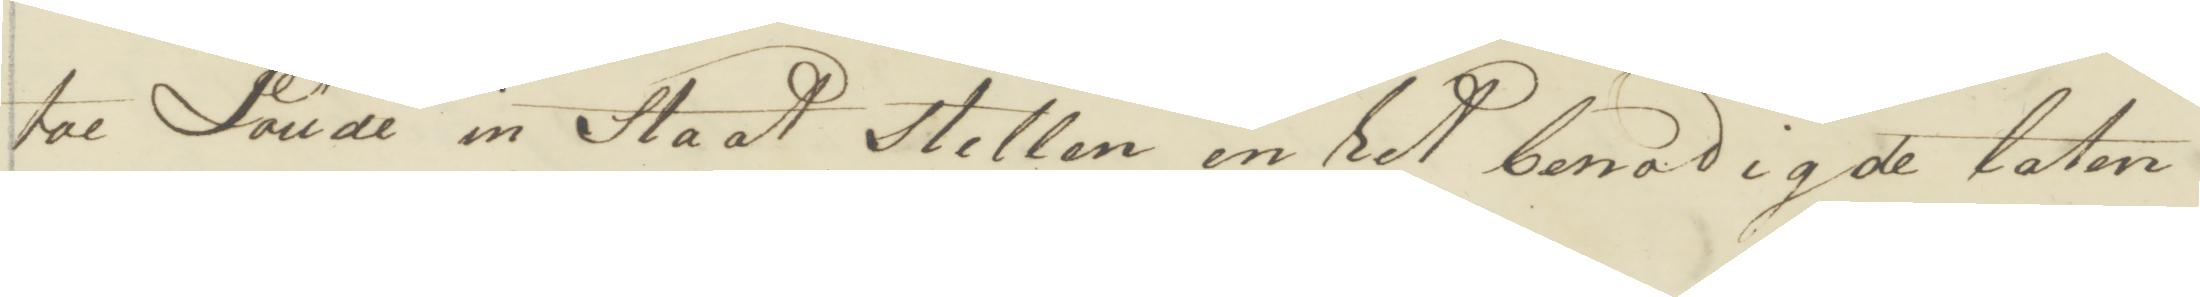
toe Soude in staat stellen en het benodigde laten
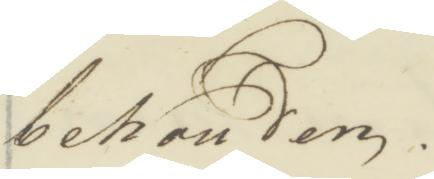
behouden.
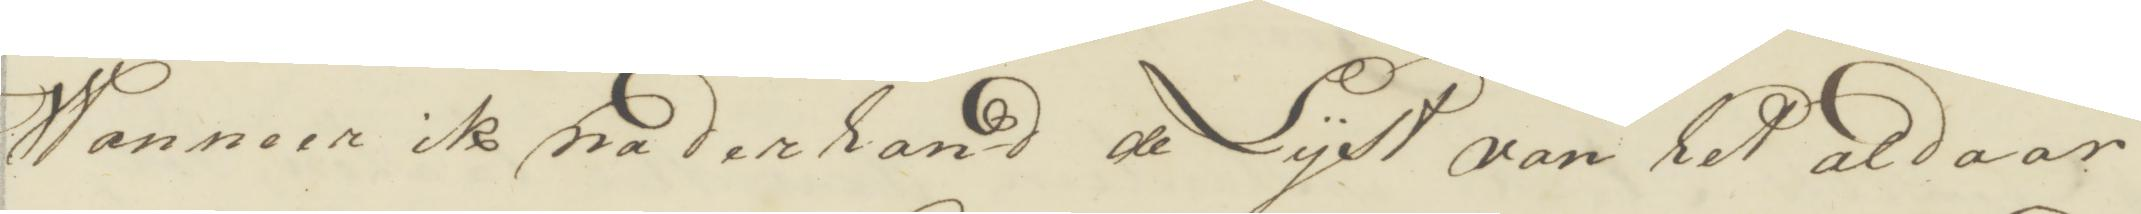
Wanneer ik naderhand de Lijst van het aldaar
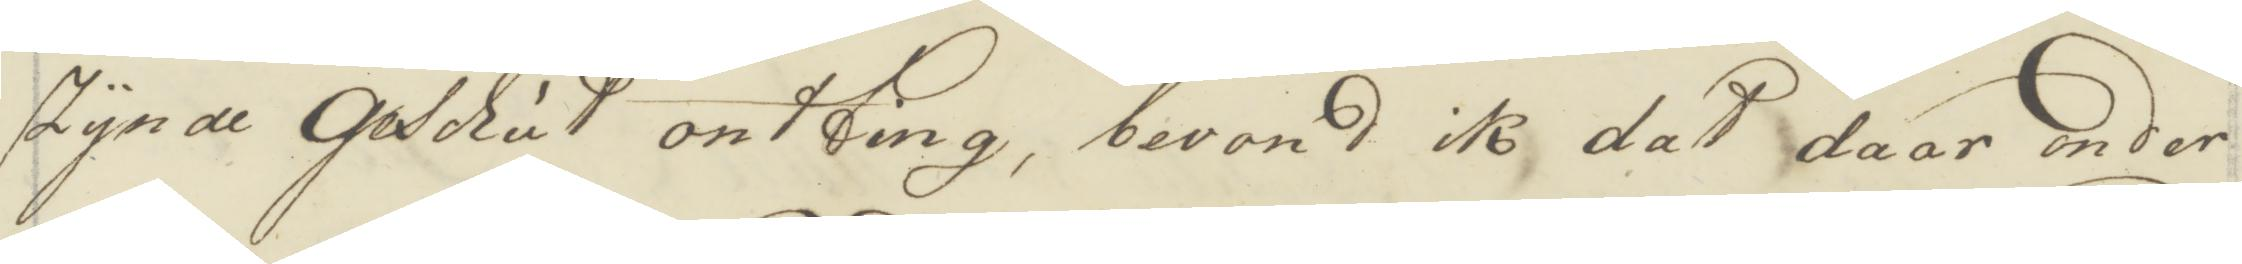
zijnde geschut ontfing, bevond ik dat daar onder
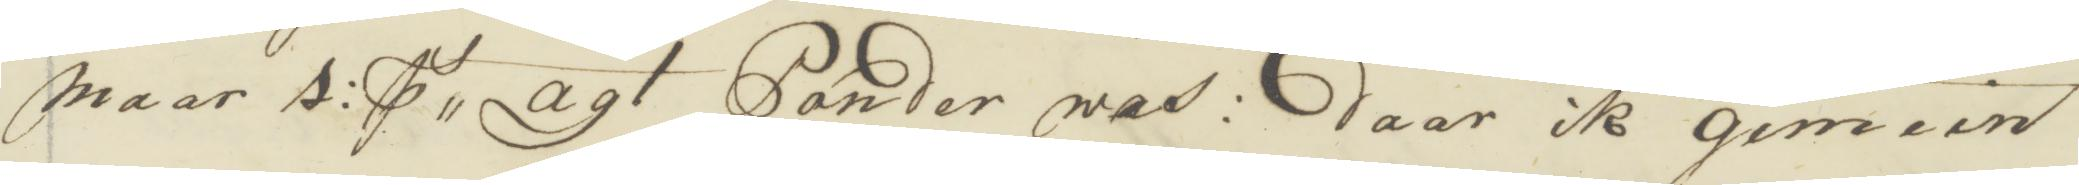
maar 1: p„s agt Ponder was: daar ik gemeent
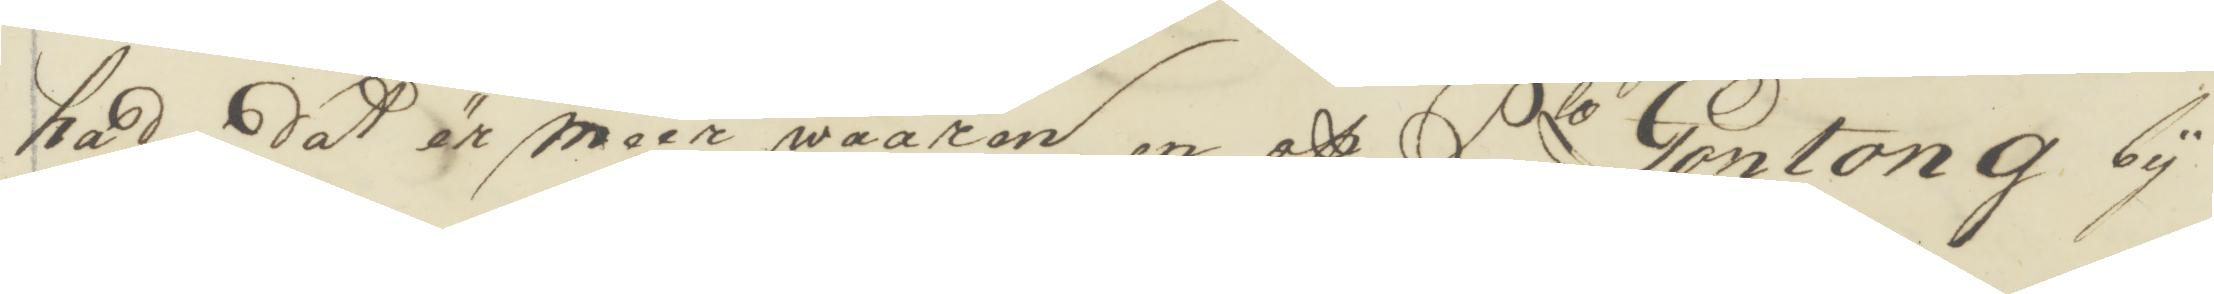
had dat "er meer waaren en op Plo Gontong bij
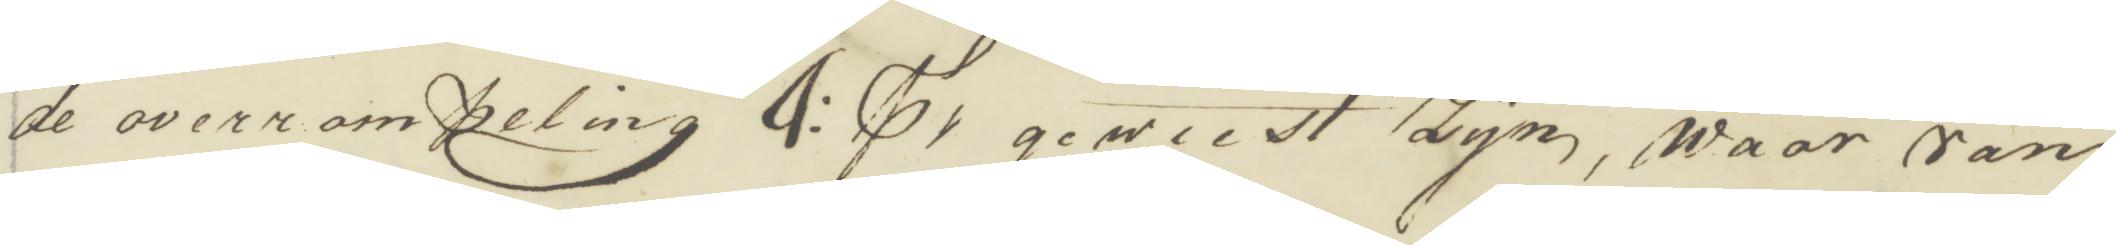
de overrompeling 4: p„s geweest zijn, waar van
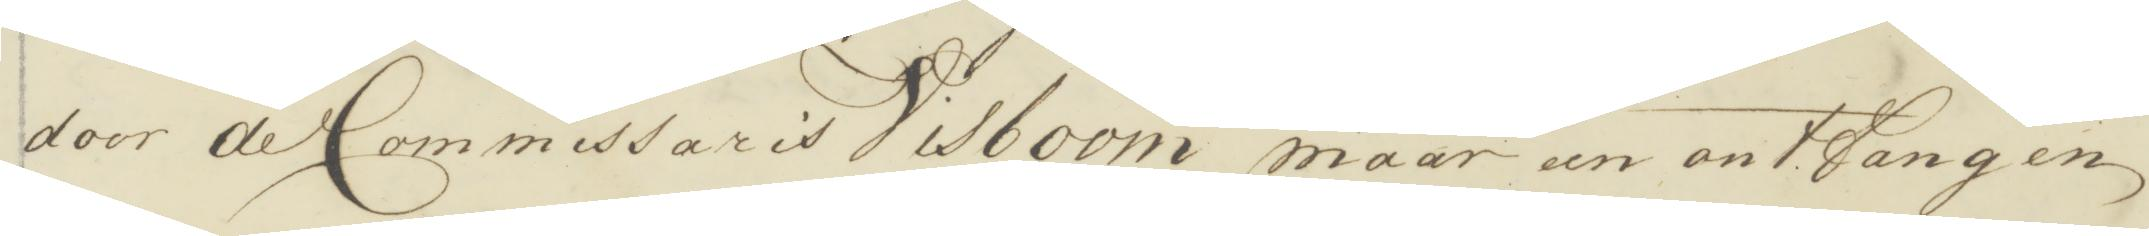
door de Commissaris Visboom maar een ontfangen
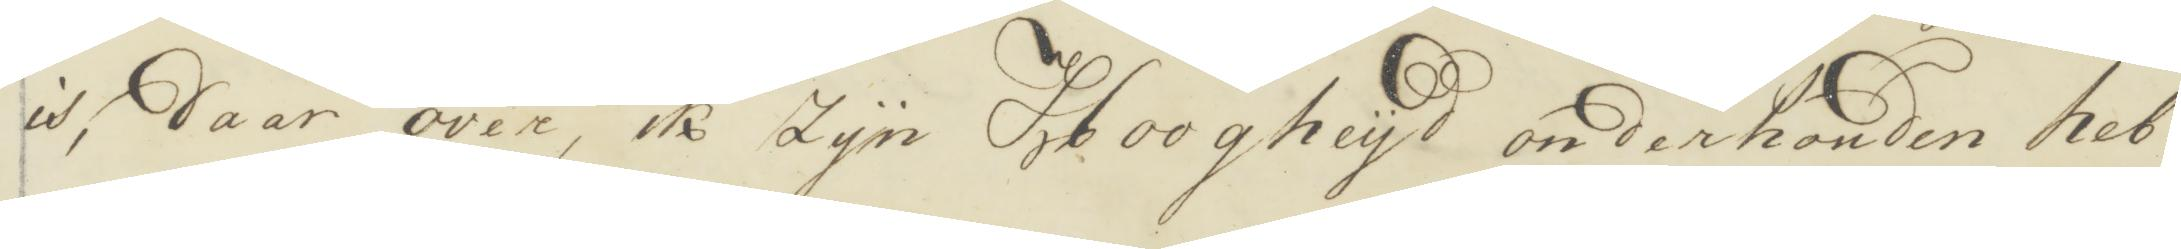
is, daar over, ik zijn Hoogheijd onderhouden heb,
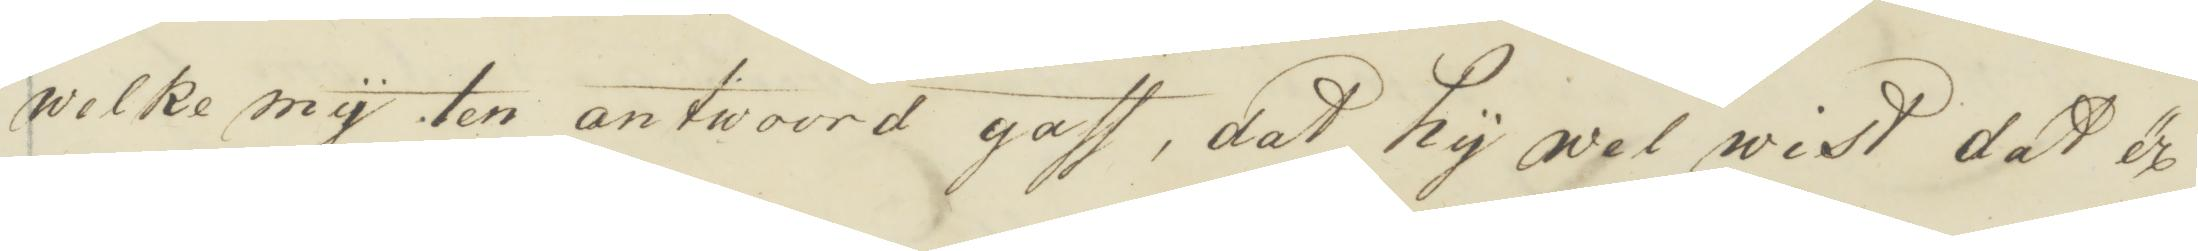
welke mij ten antwoord gaff, dat hij wel wist dat "er
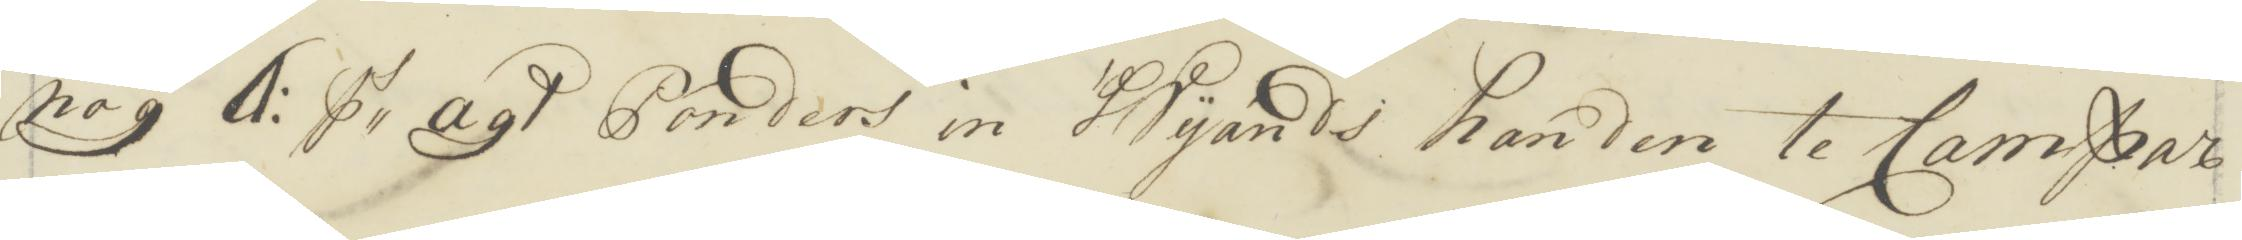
nog 4: p„s agt Ponders in 's Vijands handen te Campar
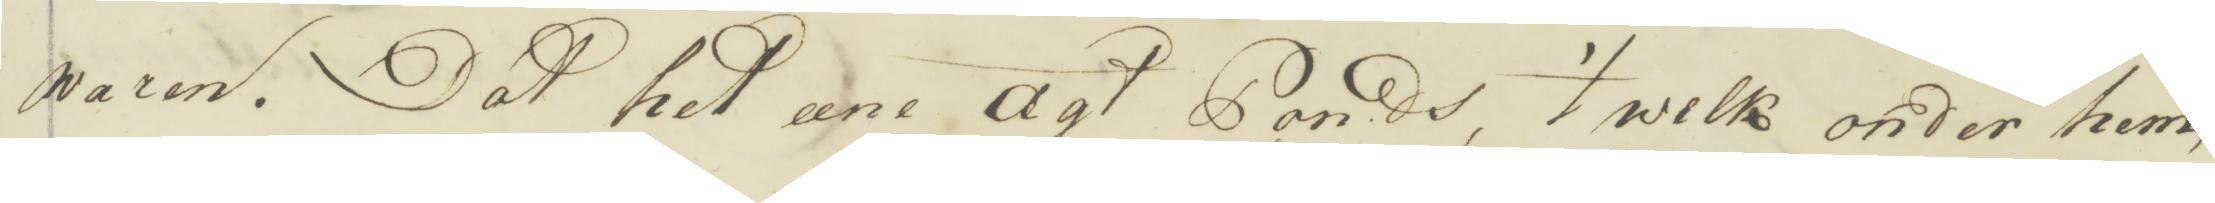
waren. Dat het eene agt Ponds, ’t welk onder hem
